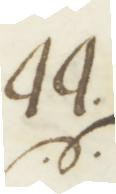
44.
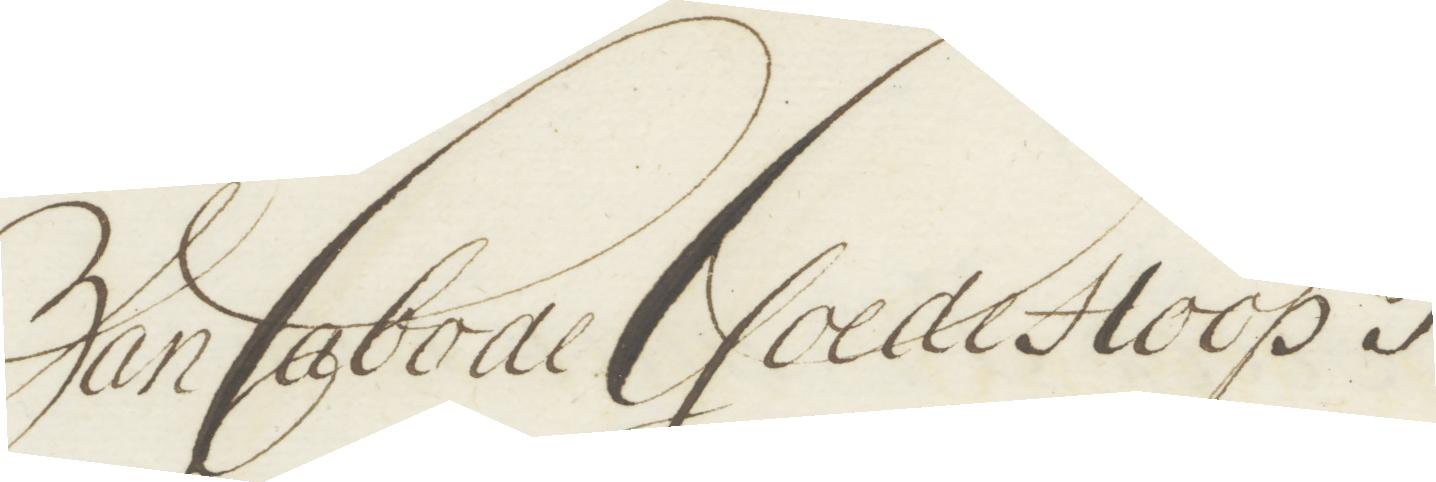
Van Cabo de Goede Hoop P=mo maij 1707:
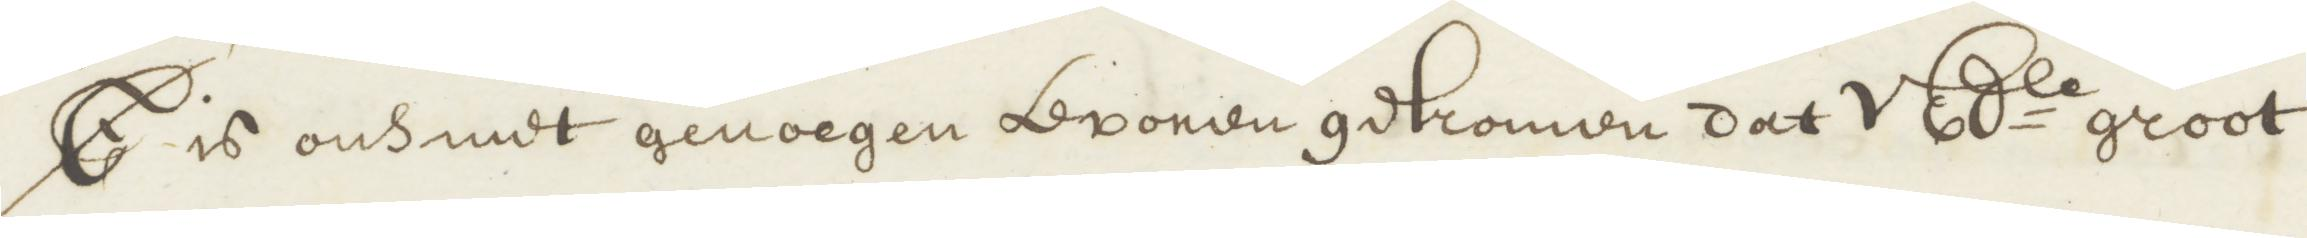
'T is ons niet genoegen tevoren gekomen dat VEd=le groot
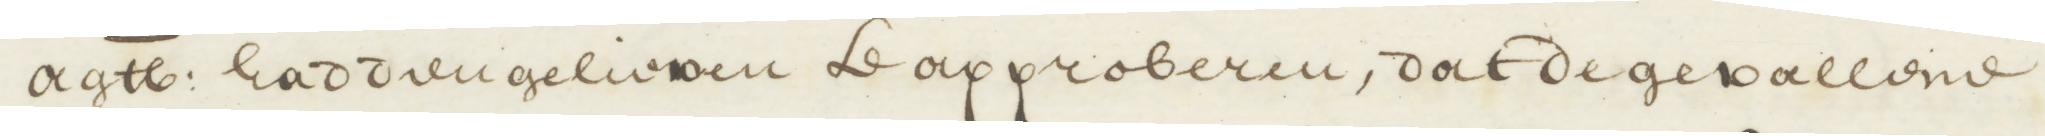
agtb: hadden gelieven te approberen, dat de gevallene
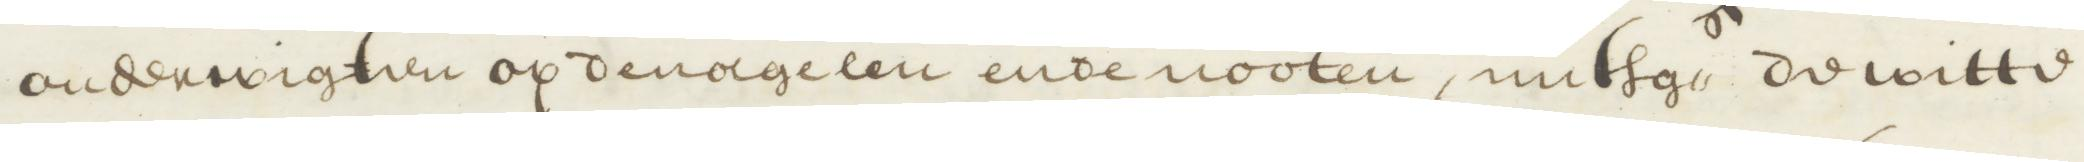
onderwigten op denagelen ende nooten, mitsg„s de witte
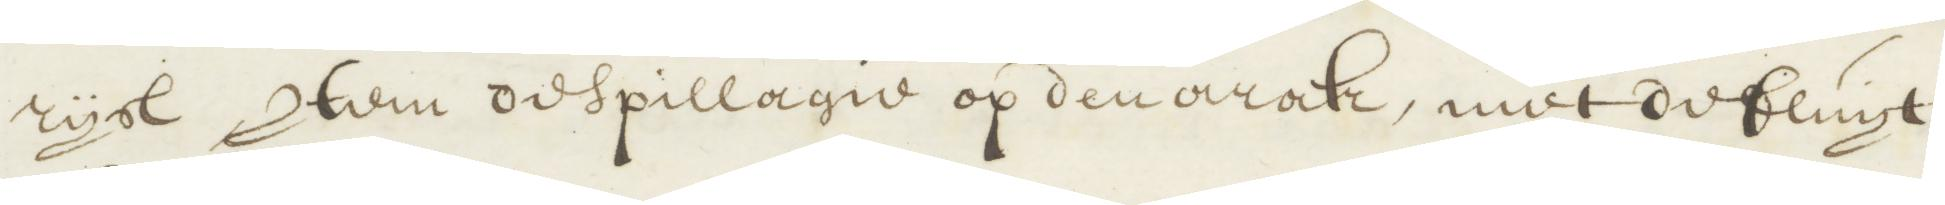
rijst, jtem de spillagie op den arak, met de fluijt
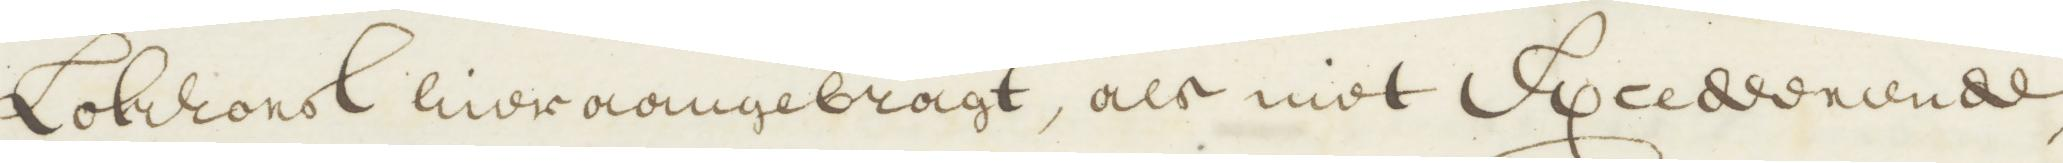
Lokhorst hier aangebragt, als niet Excedeerende,
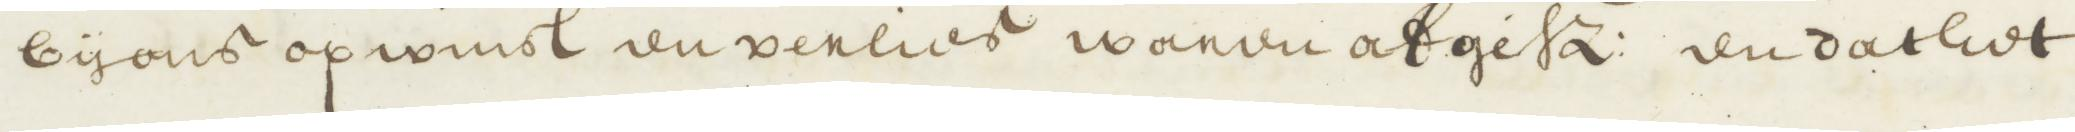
bij ons op winst en verlies waren afgesz: en dat het
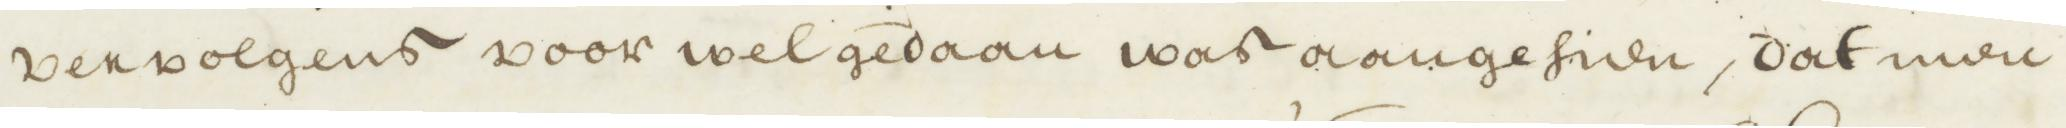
vervolgens voor wel gedaan was aangesien, dat men
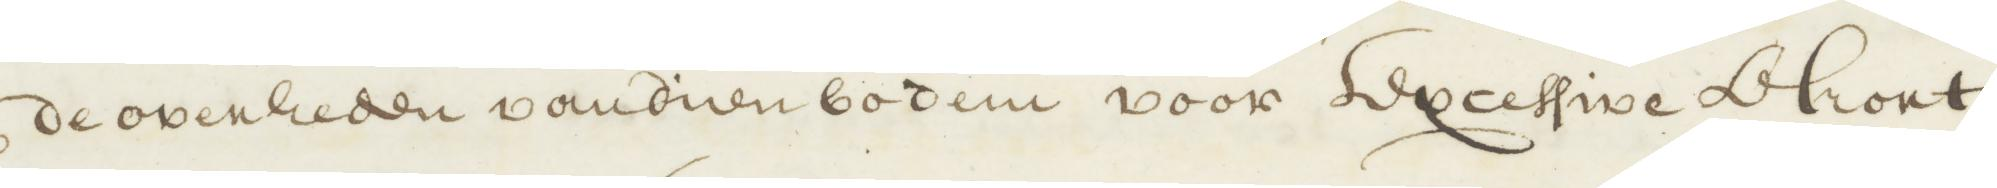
de overheden van dien bodem voor 'texcessive te kort
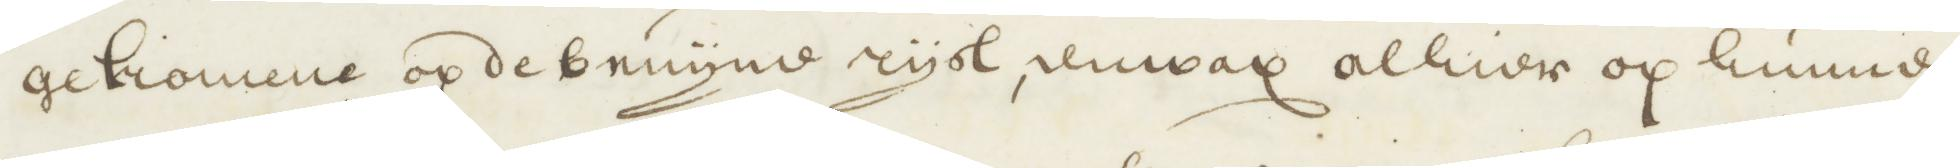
gekomene op de bruijne rijst, en wax alhier op hunne
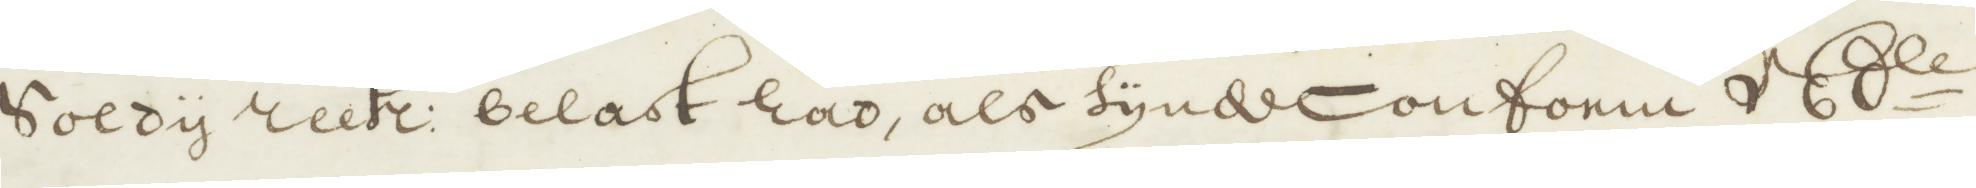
soldij reek: belast had, als sijnde conform VEd=le
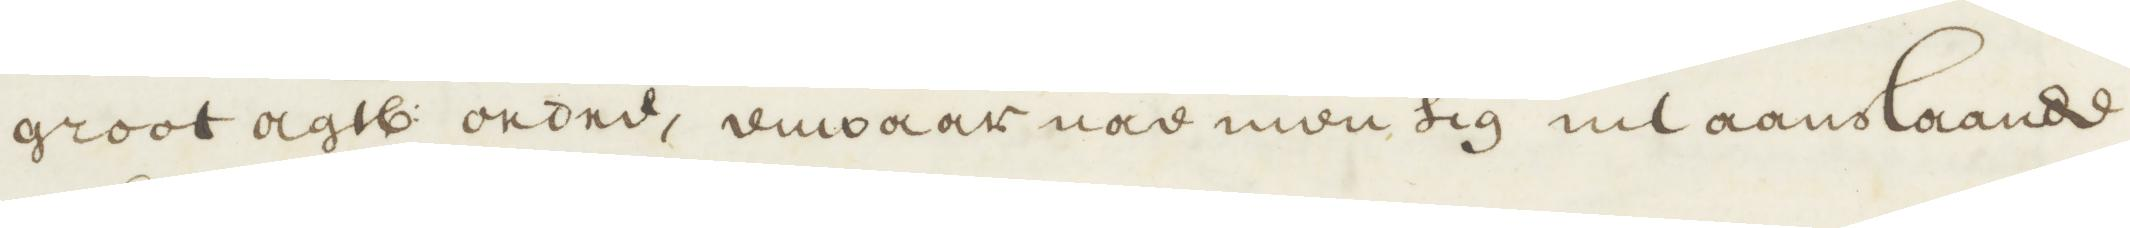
groot agtb: ordre, enwaar nae men sig in't aanstaande
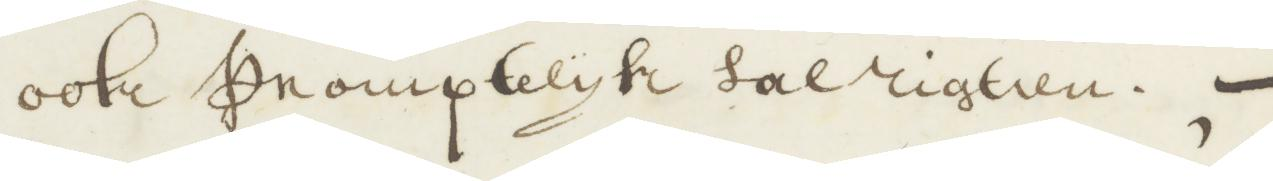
ook promptelijk sal rigten.
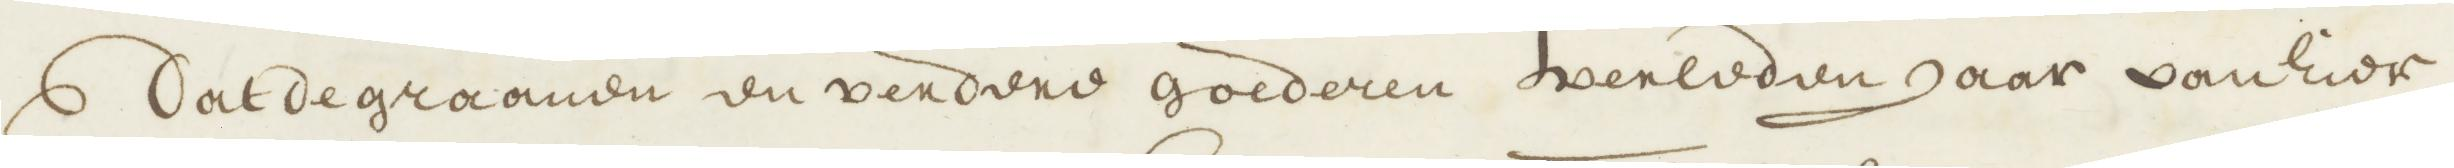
dat de graanen en verdere goederen 'tverleden jaar van hier,
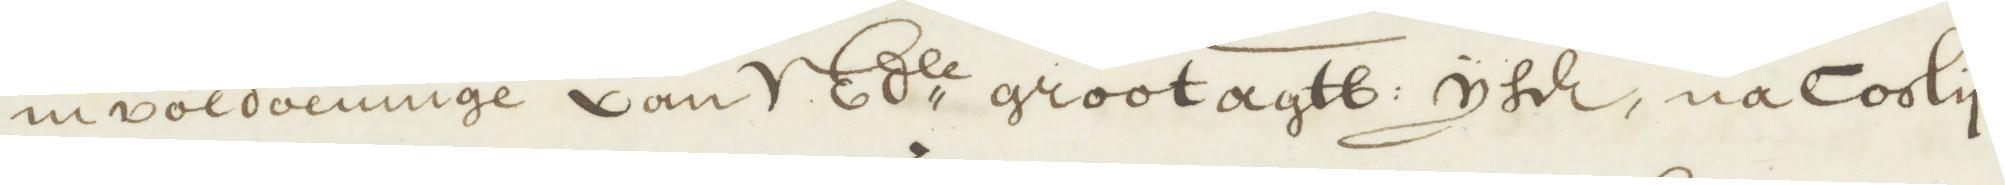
in voldoeninge van VEd„le groot agtb: ijsch, na Costij
